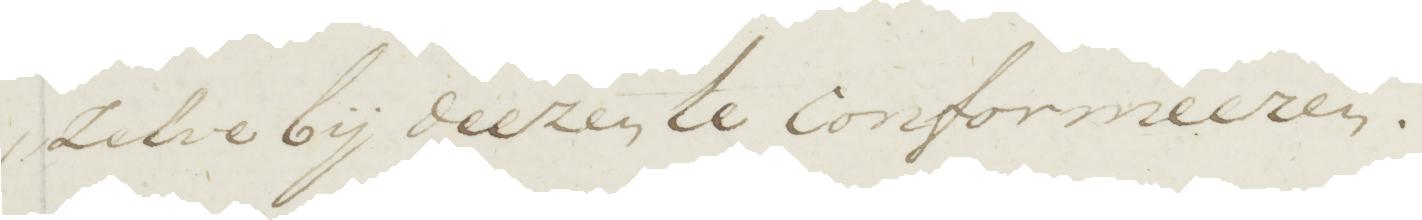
„zelve bij deezen te conformeeren.
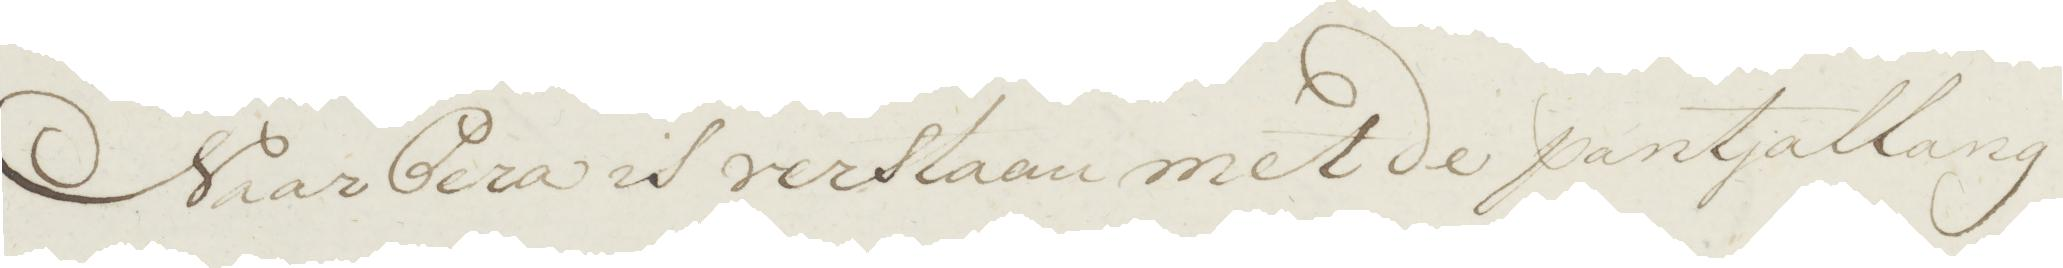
Naar Pera is verstaan met de pantjallang
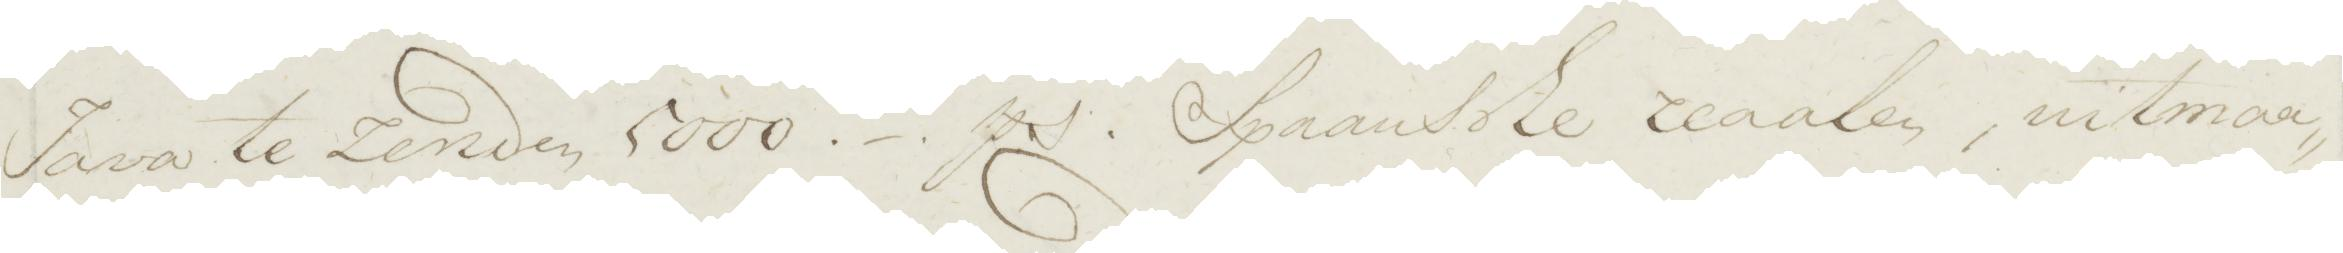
Java te zenden 5000.–. ps. Spaansche reaalen, uitmaa„
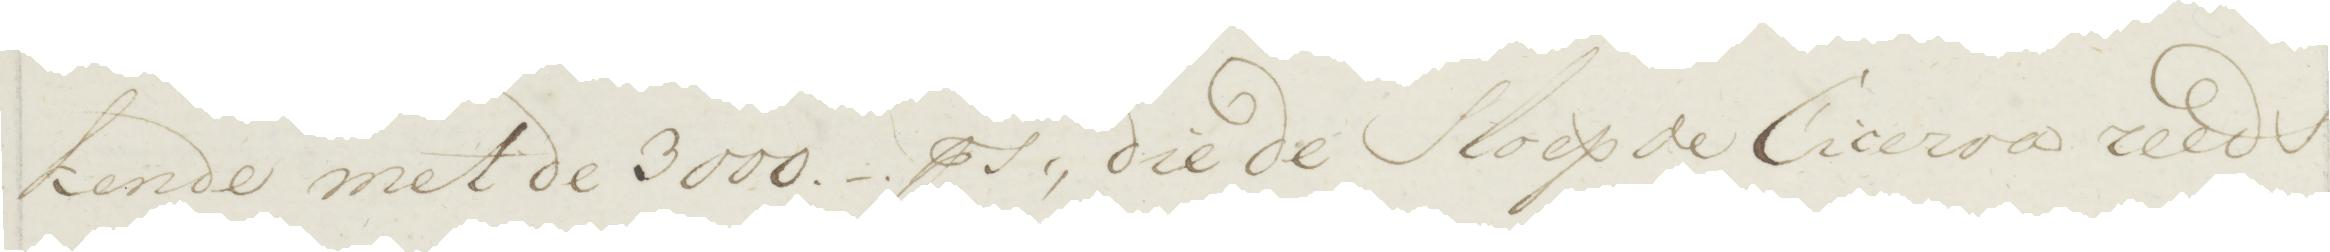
kende met de 3000.–. ps„ die de Sloep de Ciceroa reeds
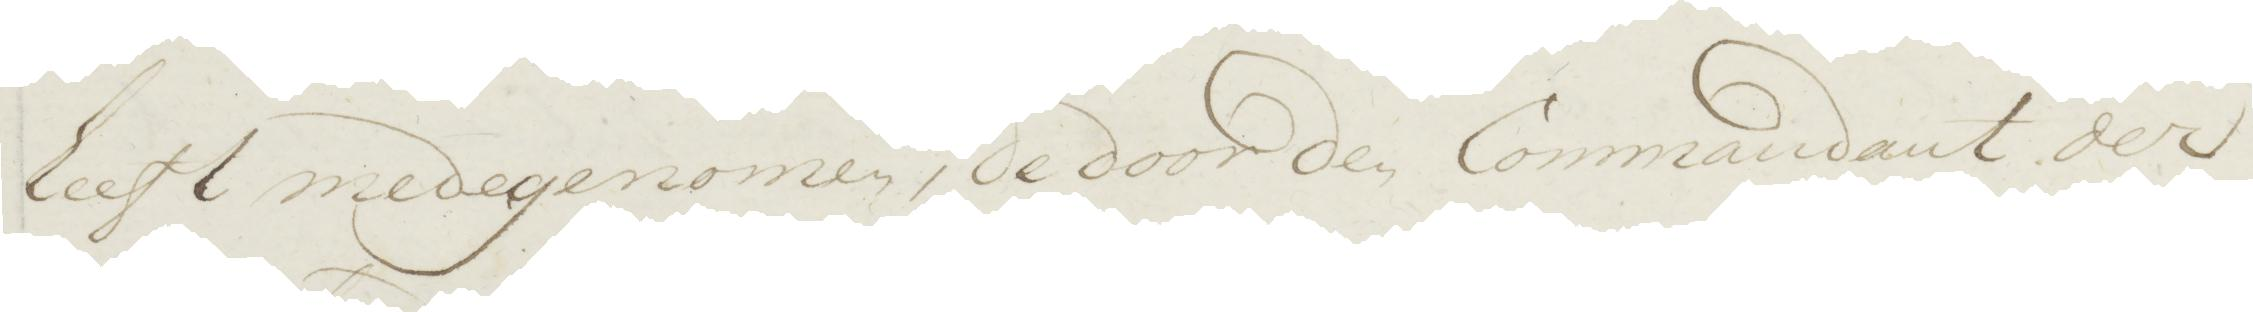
heeft medegenomen, de door den Commandant der
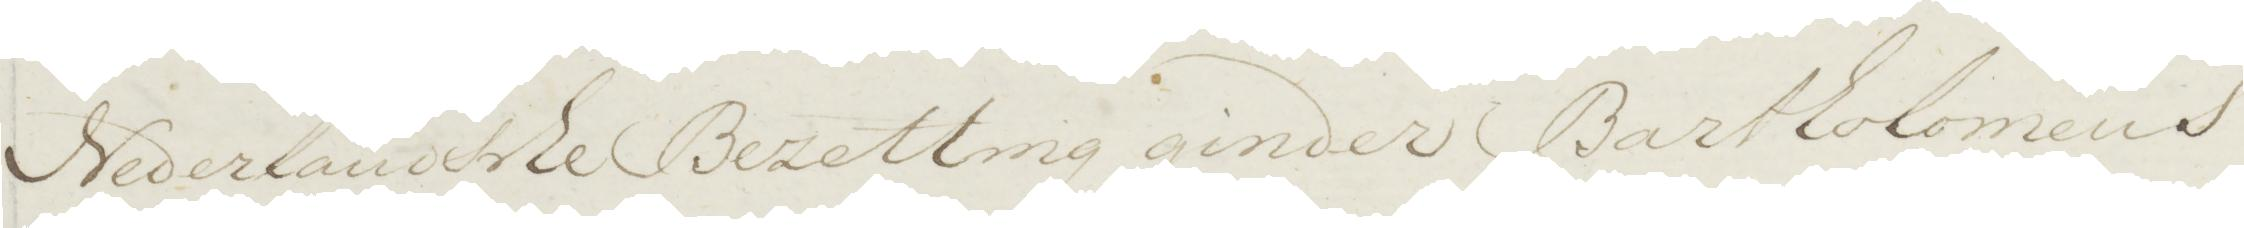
Nederlandsche Bezetting ginder Bartholomeus
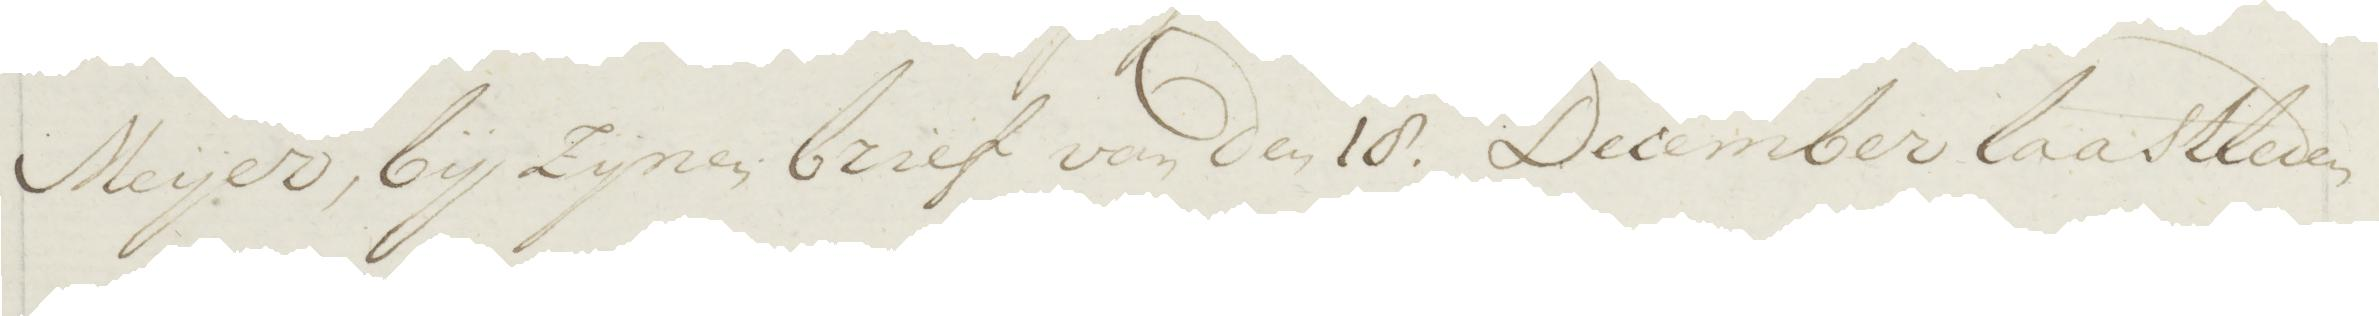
Meijer, bij zijnen brief van den 18. December laastleden
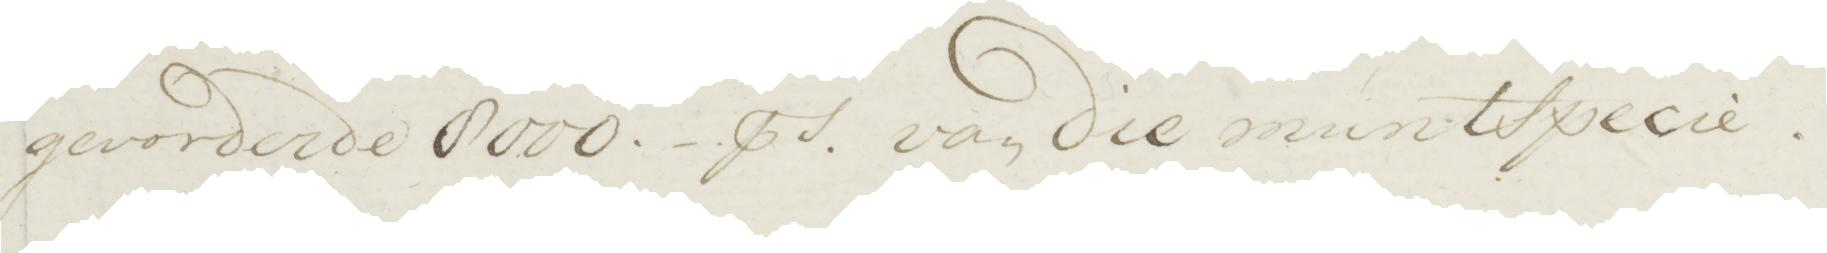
gevorderde 8000.–. ps. van die muntspecie.
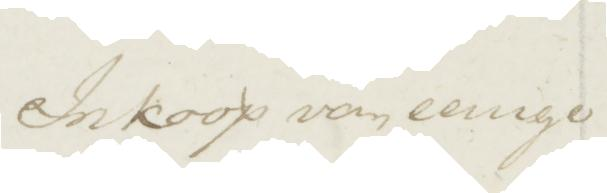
Inkoop van eenige
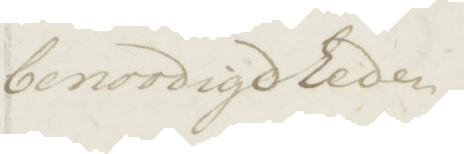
benoodigdheden
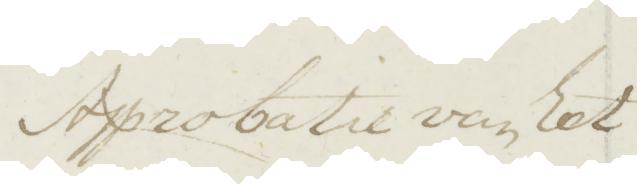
Approbatie van het
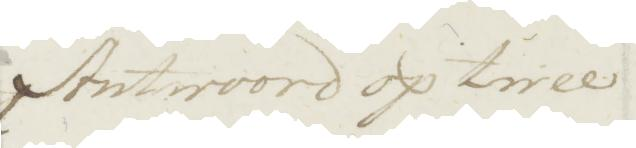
Antwoord op twee
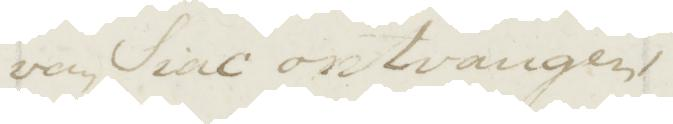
van Siac ontvangen,
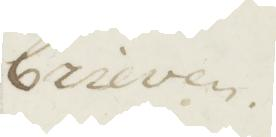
brieven.
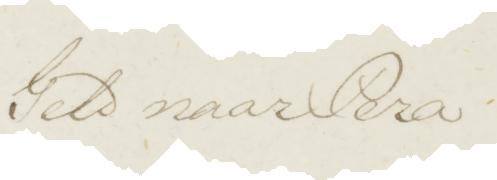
Geld naar Pera
